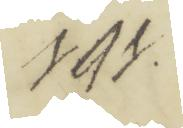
141:
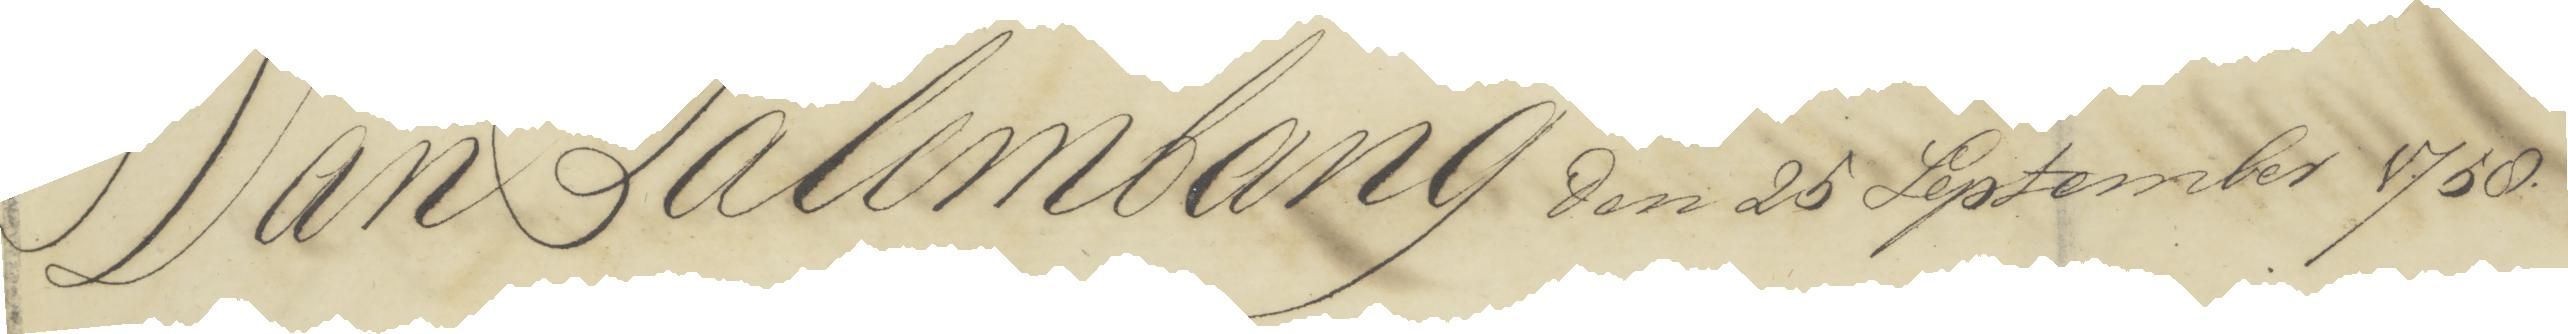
Van Palembang den 25 September 1758.
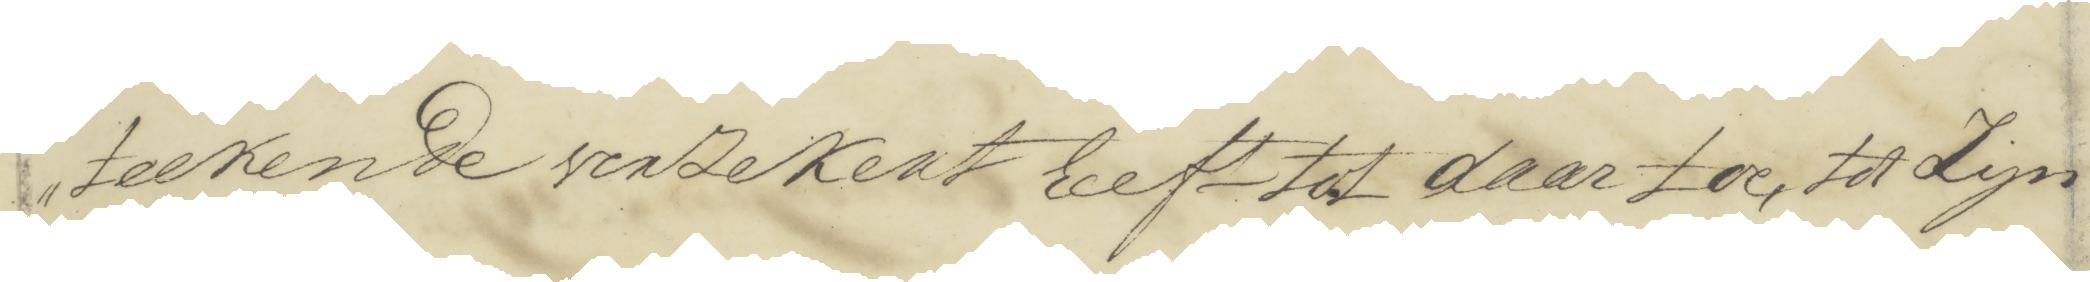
„teekende verzekert heeft tot daar toe, tot Zijn
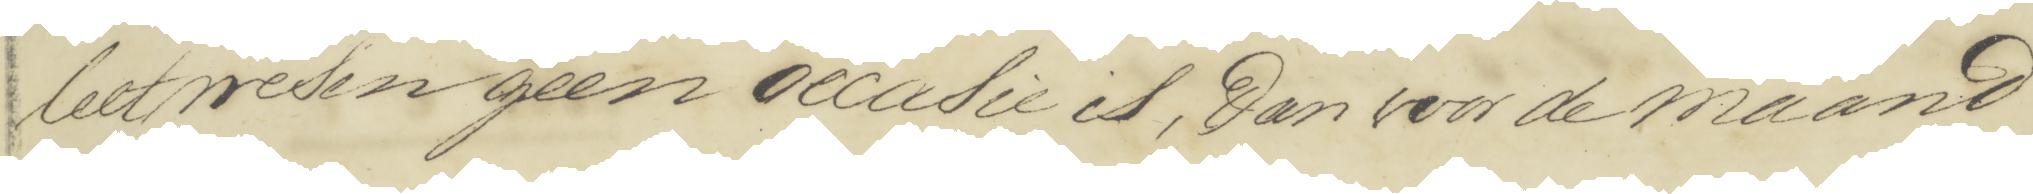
leetwesen geen occasie is, dan voor de maand
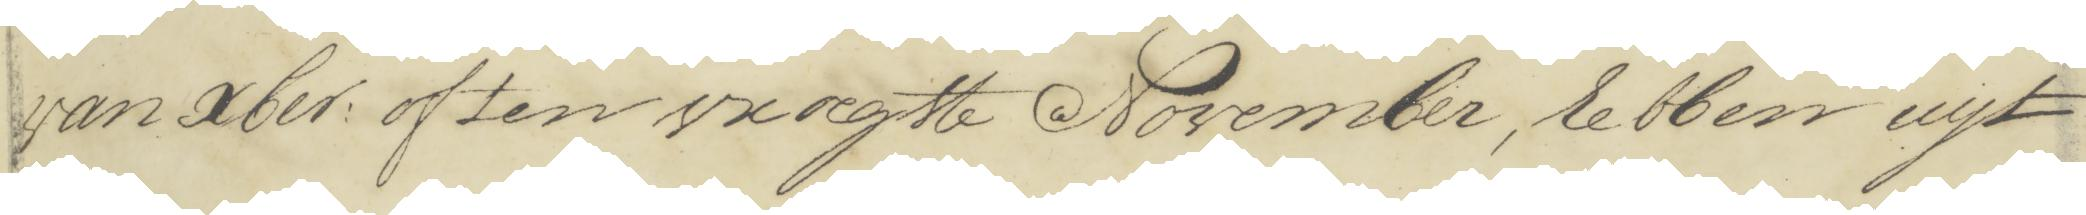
van xber: of ten vroegste November, hebben uijt
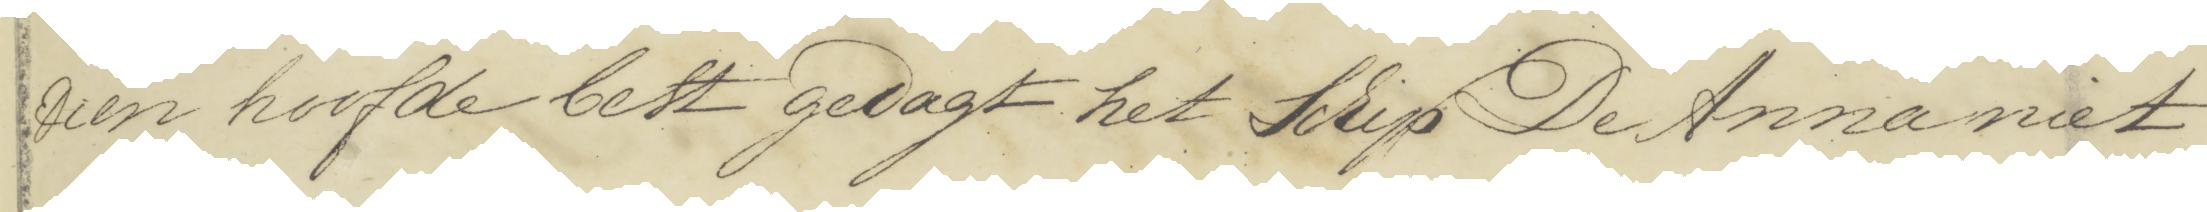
dien hoofde best gedagt het schip De Anna niet
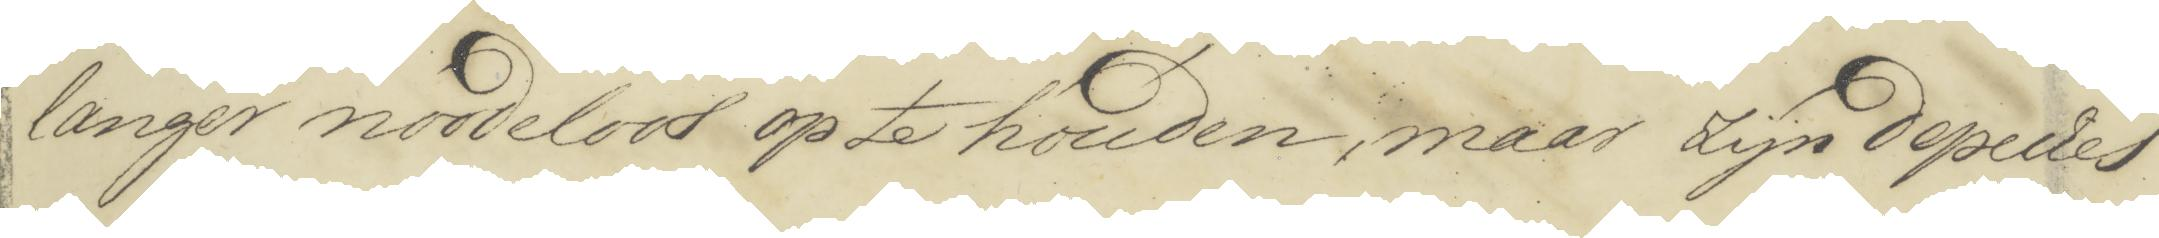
langer noodeloos op te houden, maar zijn depeches
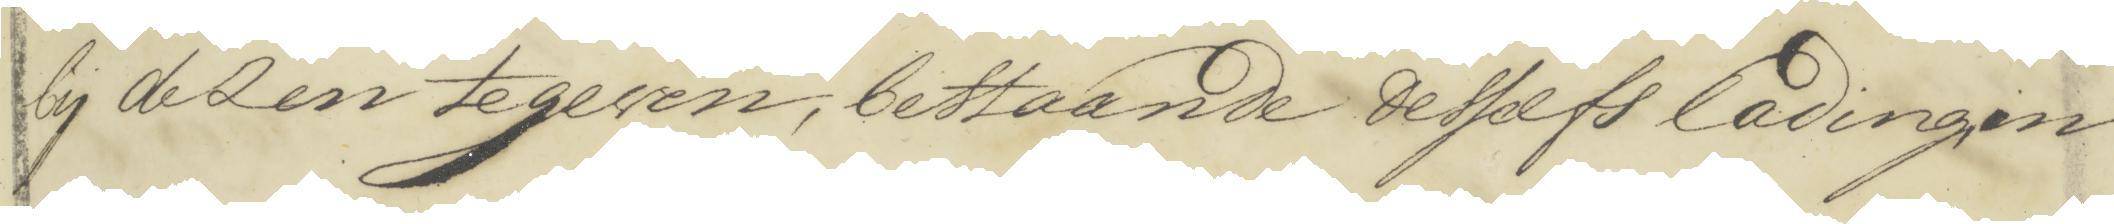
bij dezen tegeven, bestaande desselfs ladingen
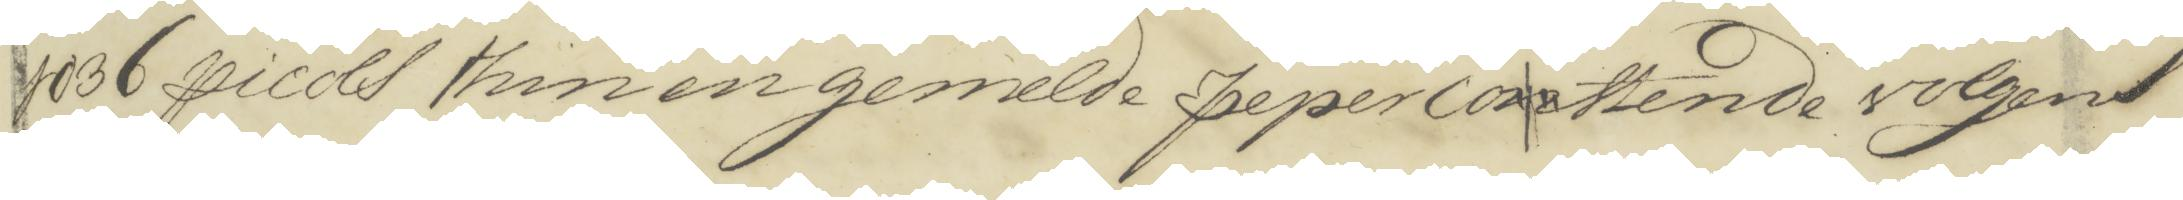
1036 picols thin en gemelde peper constende volgens
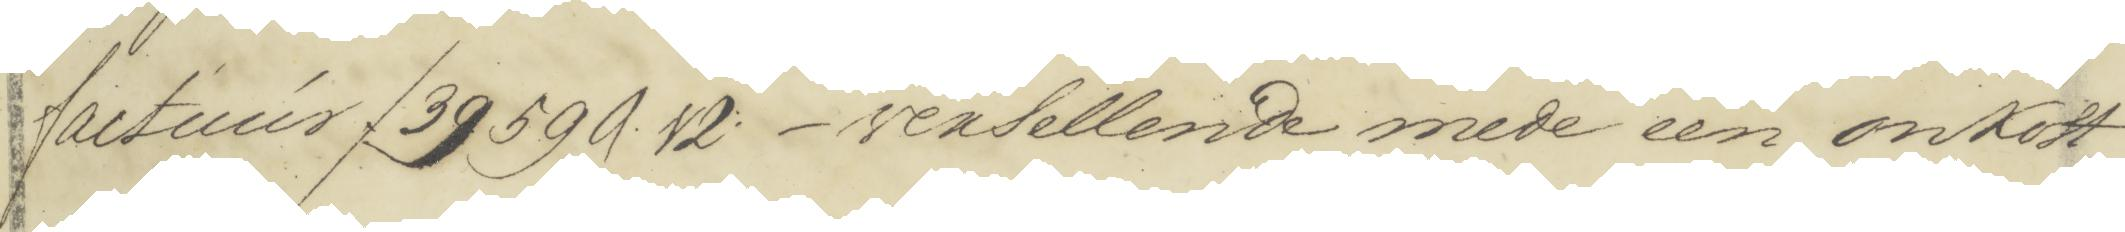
factuur ƒ 39594:12: — versellende mede een onkost
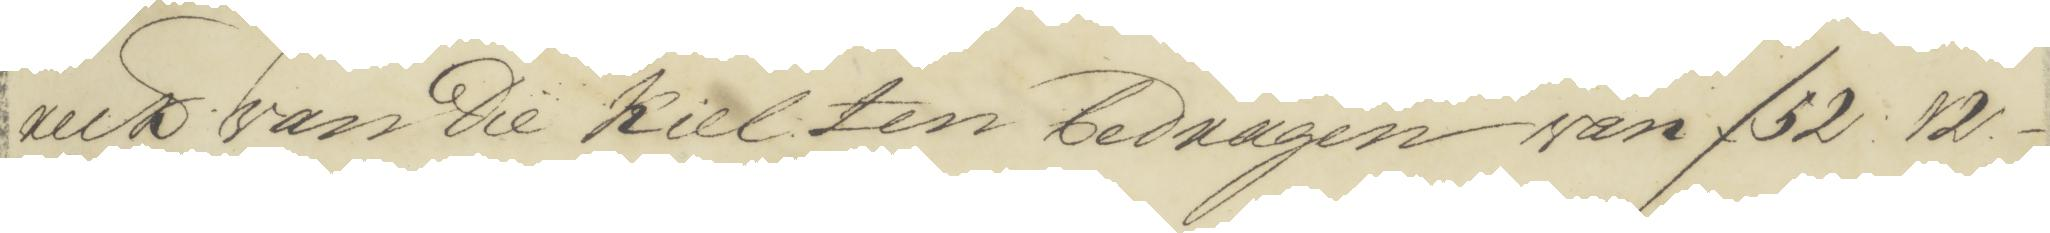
reek van die Kiel ten bedragen van ƒ52: 12: —
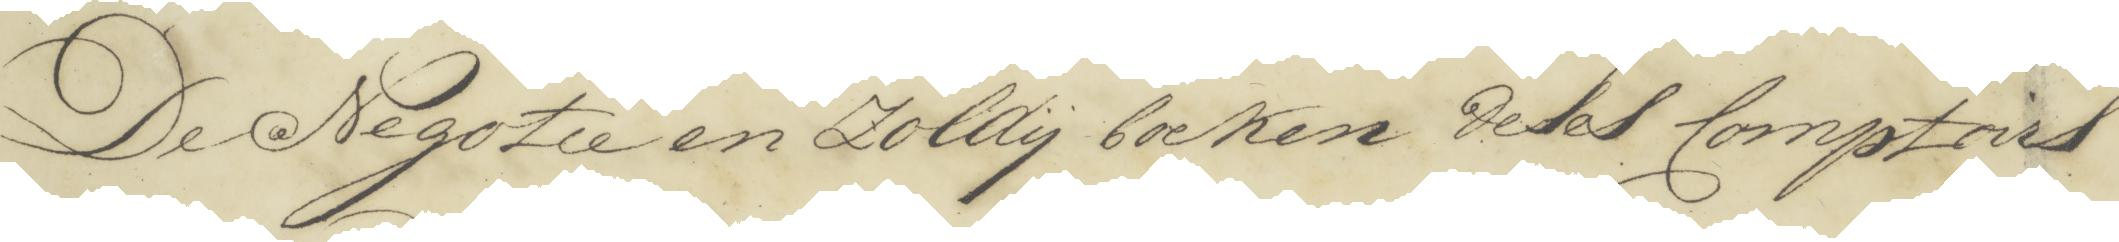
De Negotie en Zoldij boeken deses Comptoirs
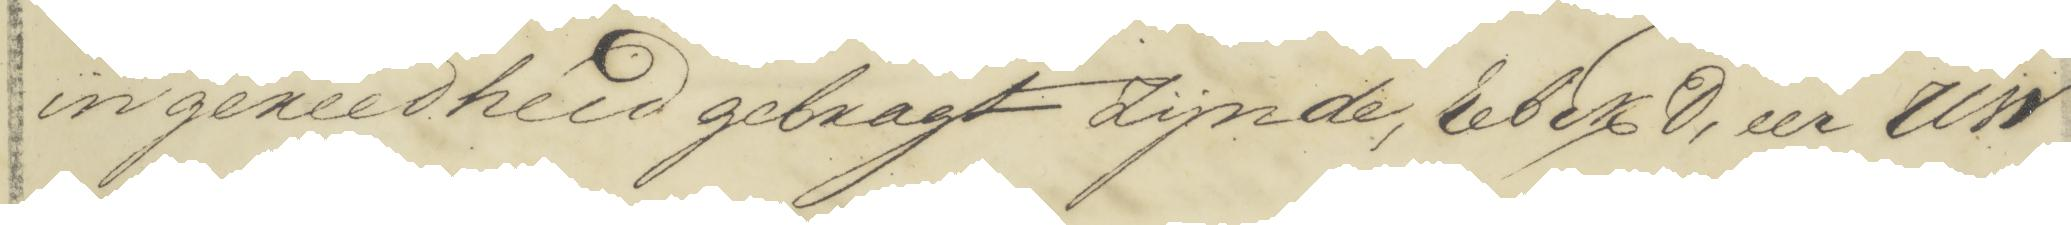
in gereedheid gebragt zijnde, heb ik d, eer UW
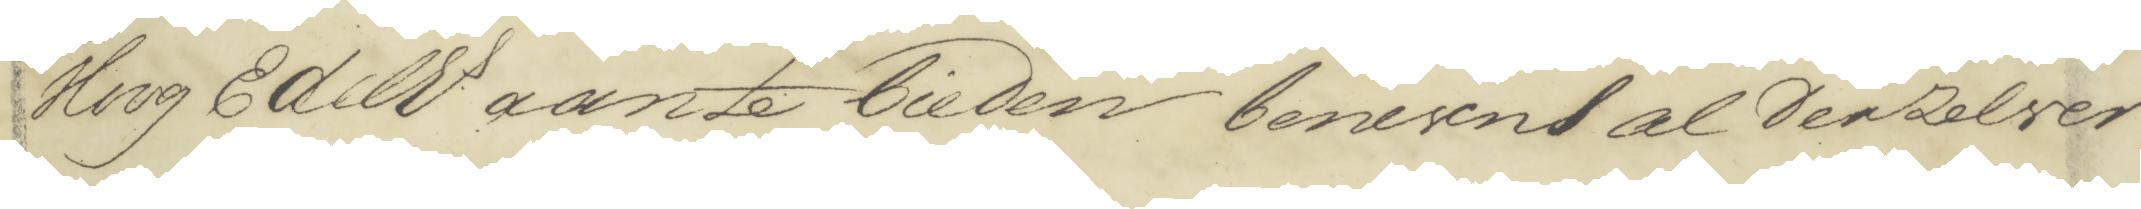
Hoog Edelh:s aante bieden benevens al derzelver
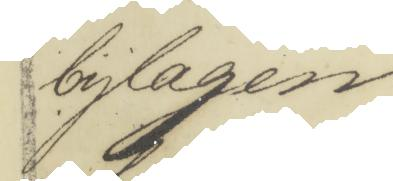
bijlagen
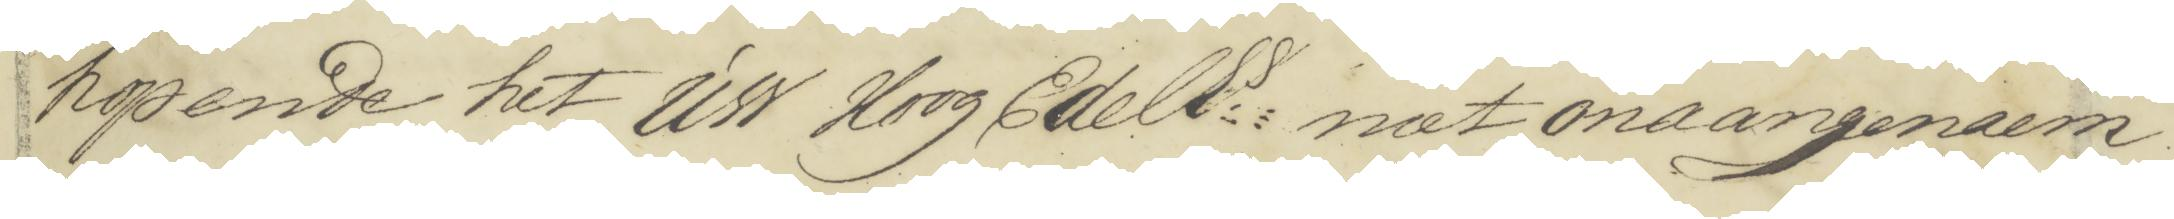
hopende het UW Hoog Edelh:s niet onaangenaem
